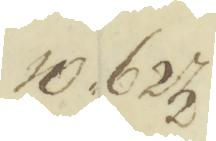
10„62½
